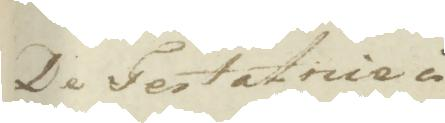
De Testatrice is
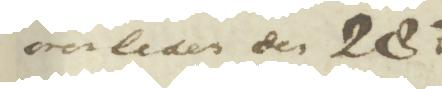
overleden den 28
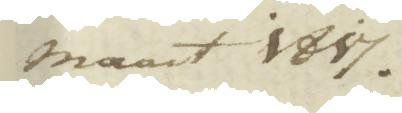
maart 1817.
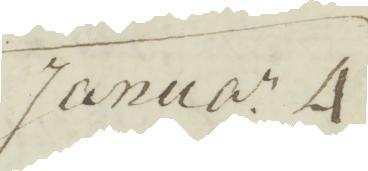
Janua.r 4
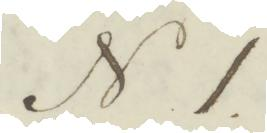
N: 1.
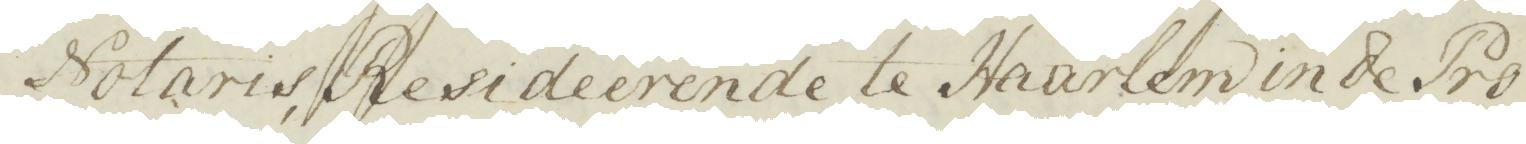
Notaris, Resideerende te Haarlem in de Pro
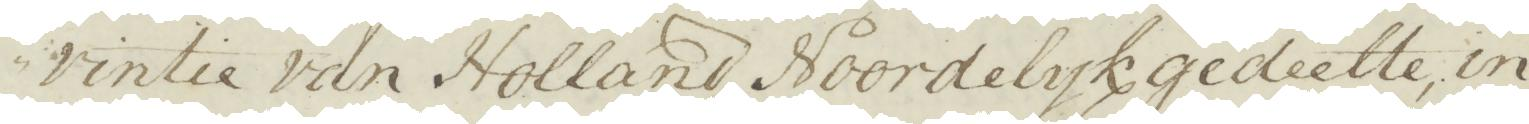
„vintie van Holland, Noordelyk gedeelte, in
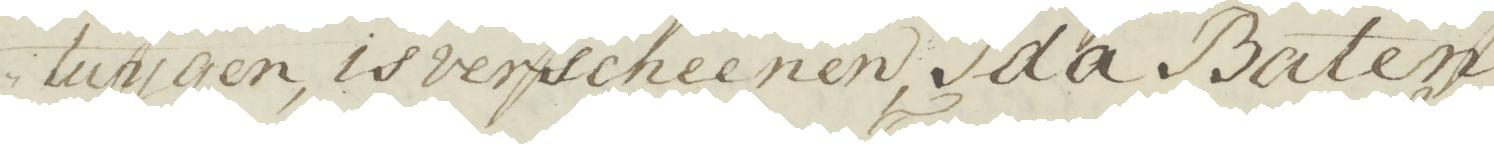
„tuygen, is verscheenen, Ida Baten
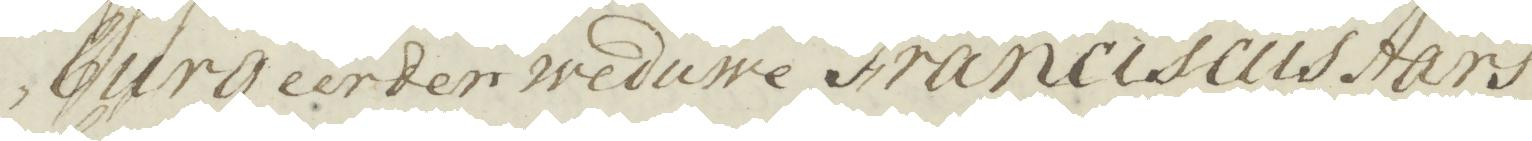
„burg eerder weduwe Franciscus Aars
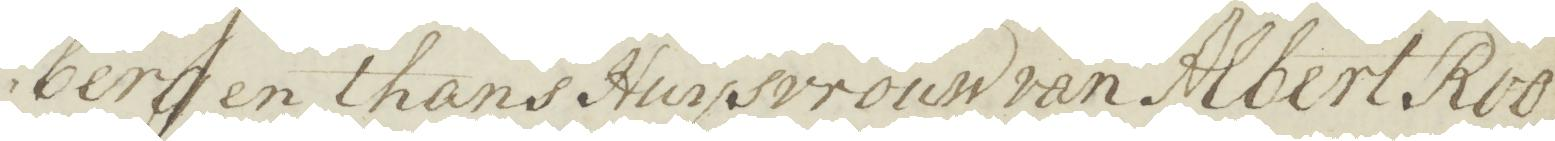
„berg en thans Huysvrouw van Albert Roo
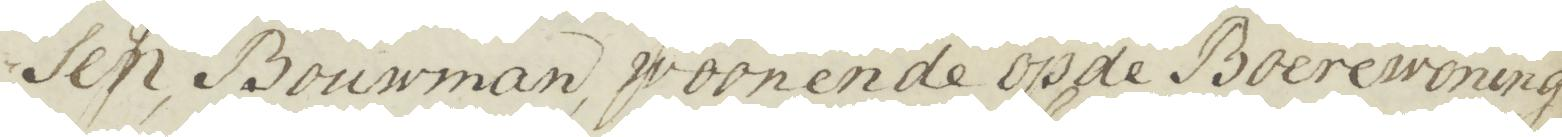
„sen, Bouwman, woonende op de Boerewoning
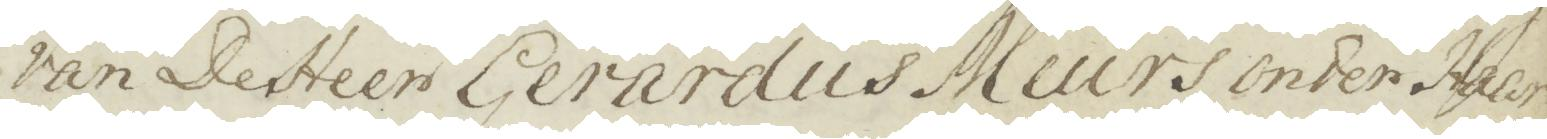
van De Heer Gerardus Meurs onder Haar
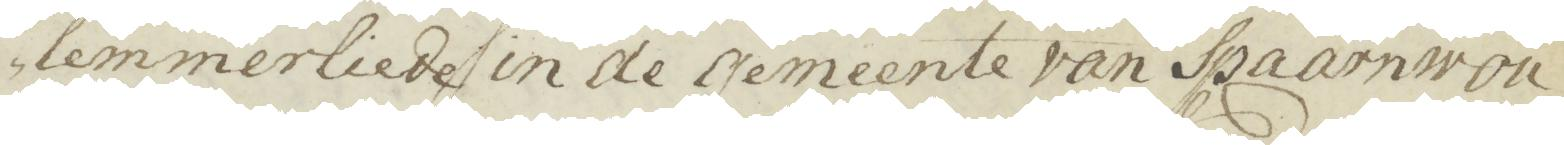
„lemmerliede in de gemeente van Spaarnwou
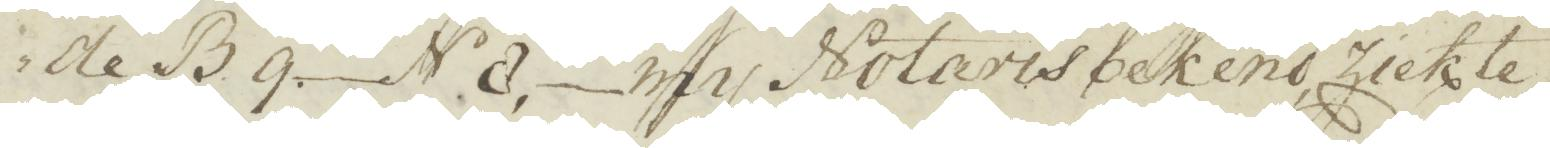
„de B 9.— N. 8, —my Notaris bekend, ziek te
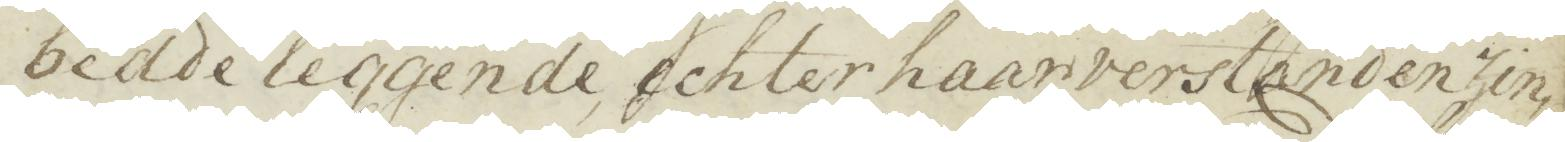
bedde leggende, echter haar verstand en zin,
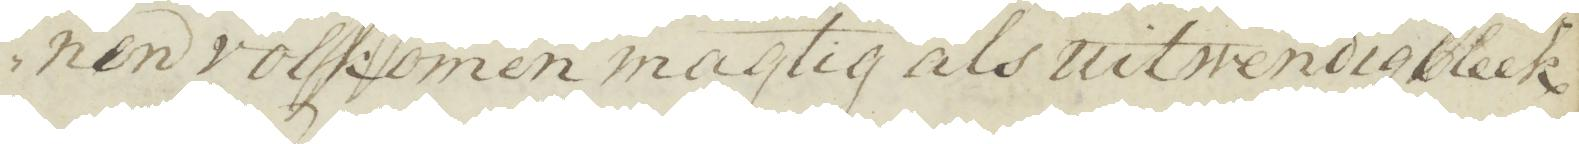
„nen volkomen magtig als uitwendig bleek
